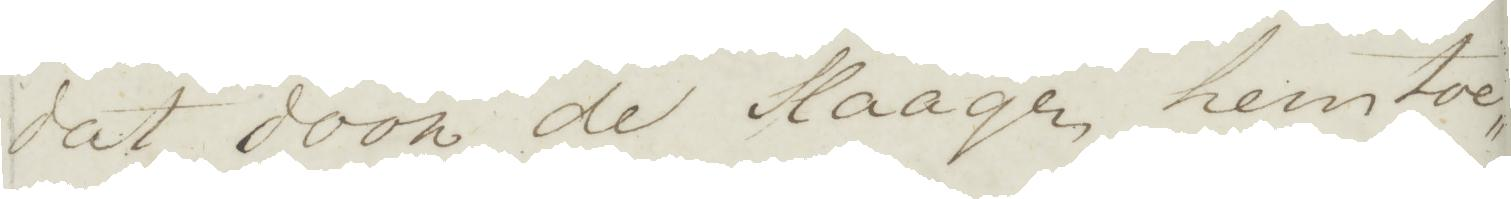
dat door de slaagen hem toe„
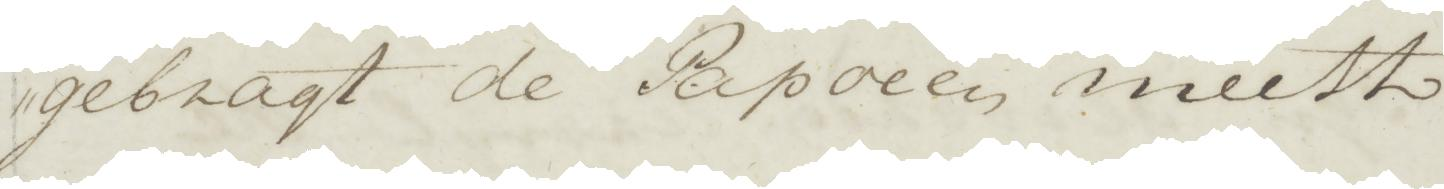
„gebragt de Papoeën meest
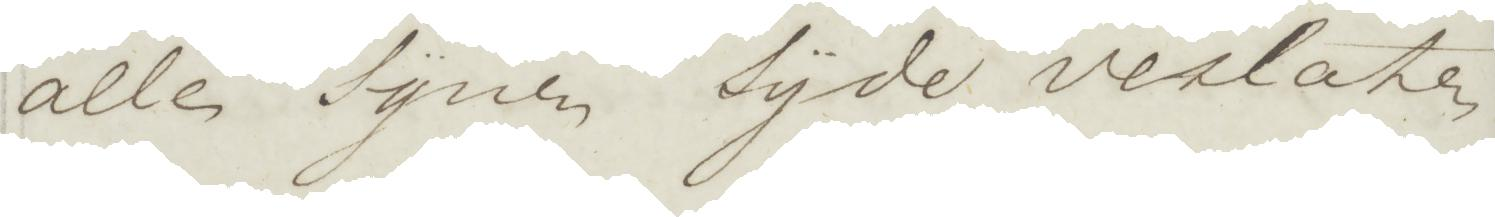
alle sijnen sijde verlaten
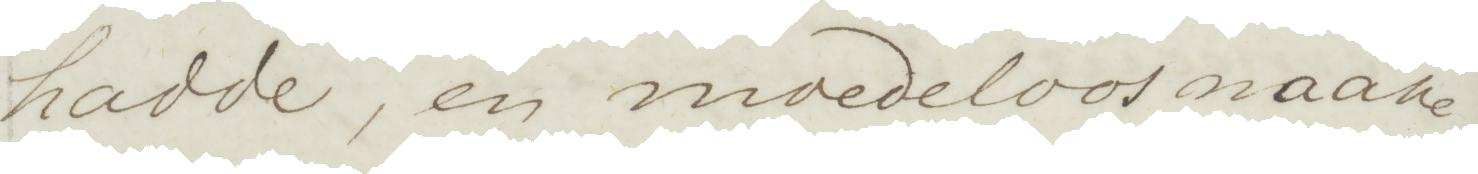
hadde, en moedeloos naar
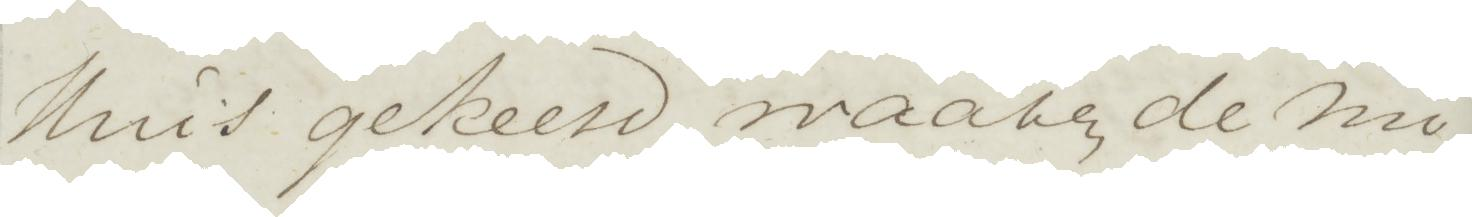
Huis gekeerd waaren de mi
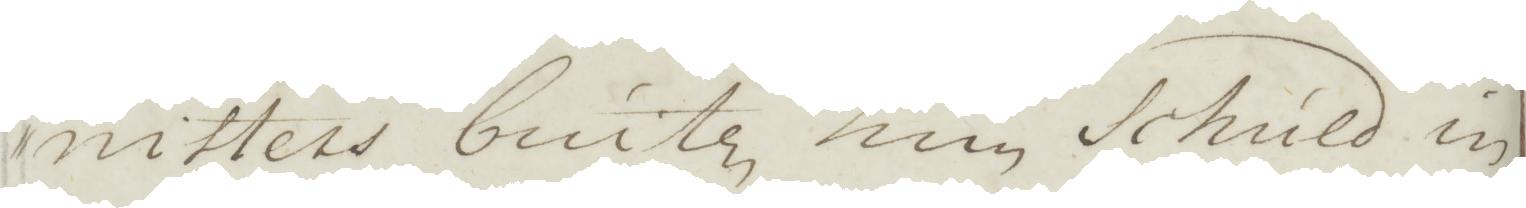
nisters buiten hun schuld in
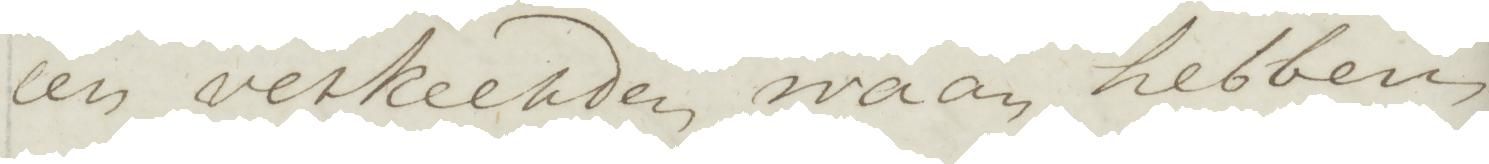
een verkeerden waan hebben
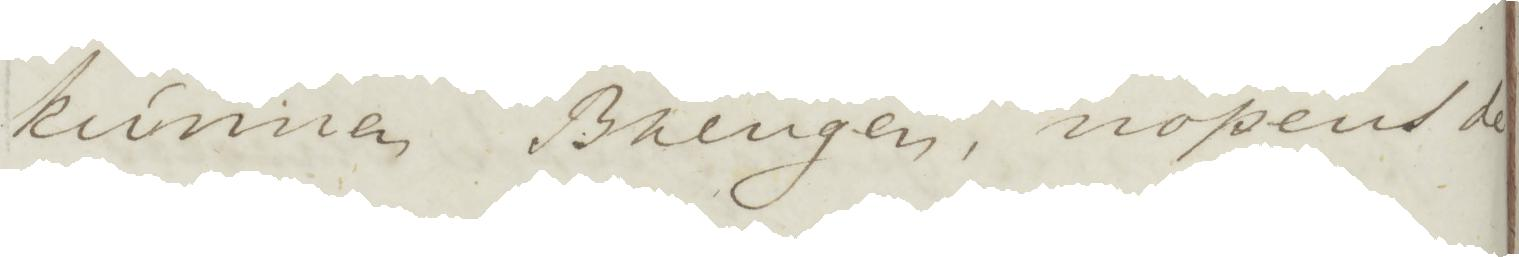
hunnen Brengen, nopens de
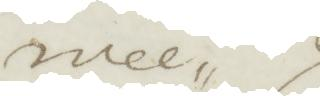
wee„
